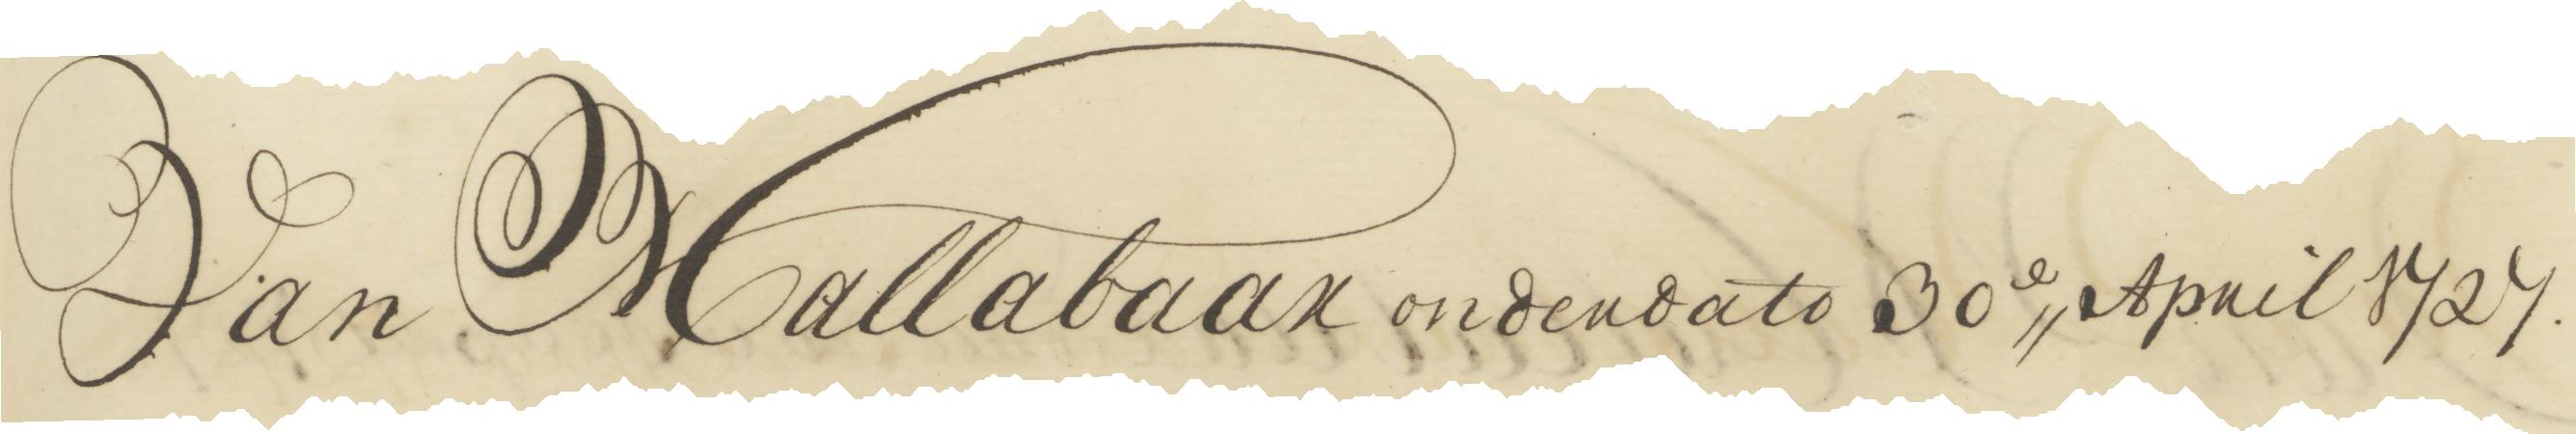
Van Mallabaar onder dato 30„e April 1727.
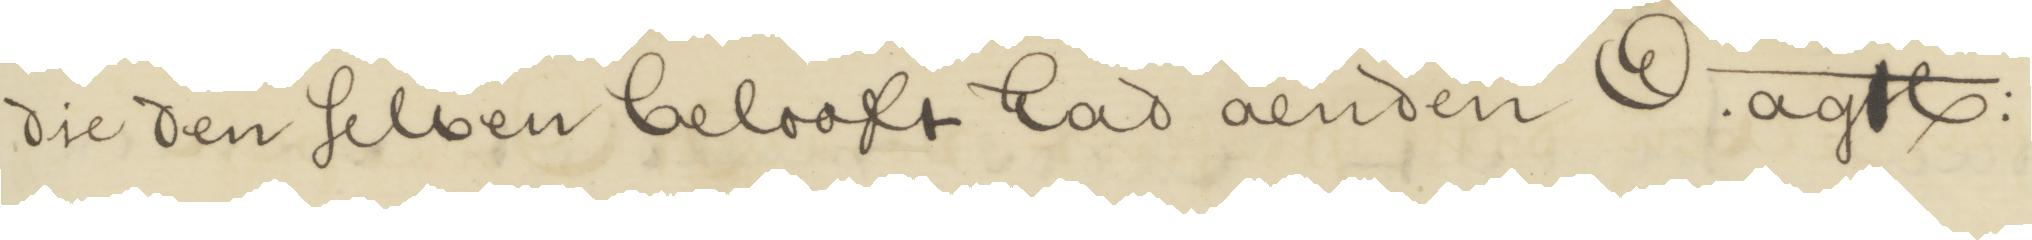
die den selven belooft had aen den E: agtb:
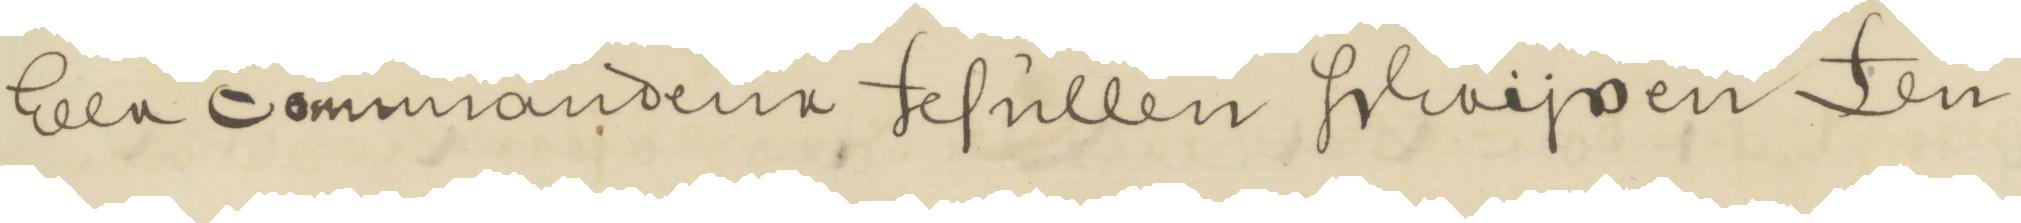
heer commandeur te sullen schrijven ten
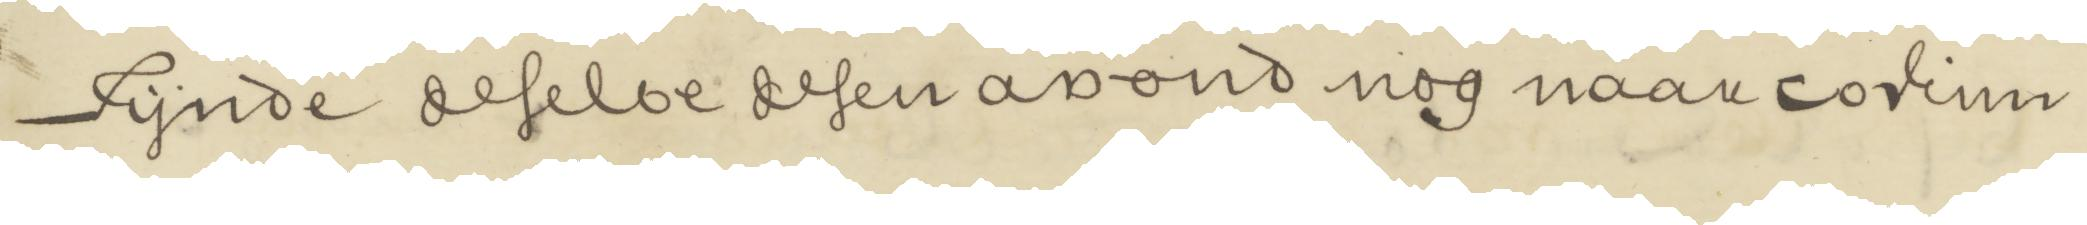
Eijnde deselve desen avond nog naar cochim
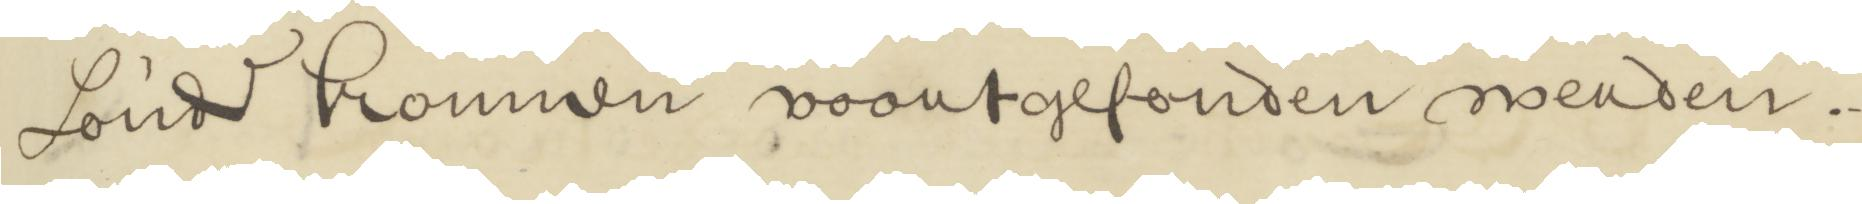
soude konnen voortgesonden werden.
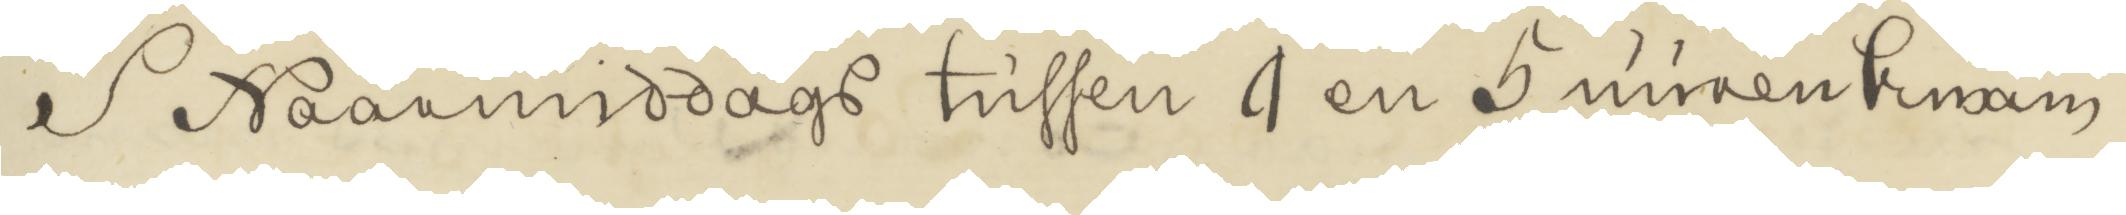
'S Naarmiddags tussen 4 en 5 uuren kwam
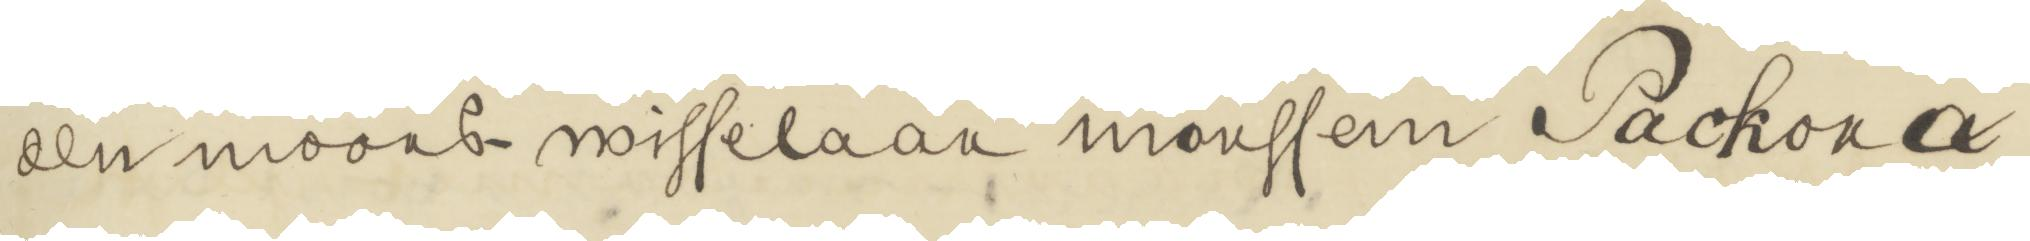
den moors wisselaar morssem Packora
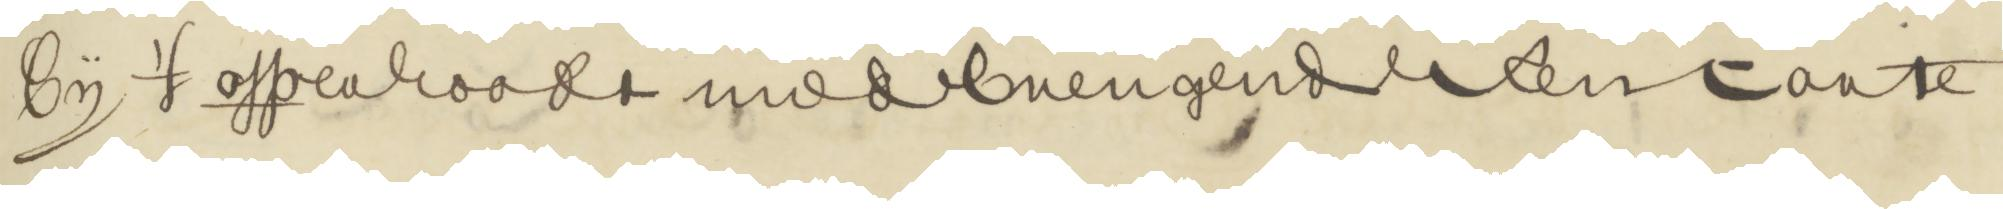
bij ’t opperhooft medebrengende Een corte
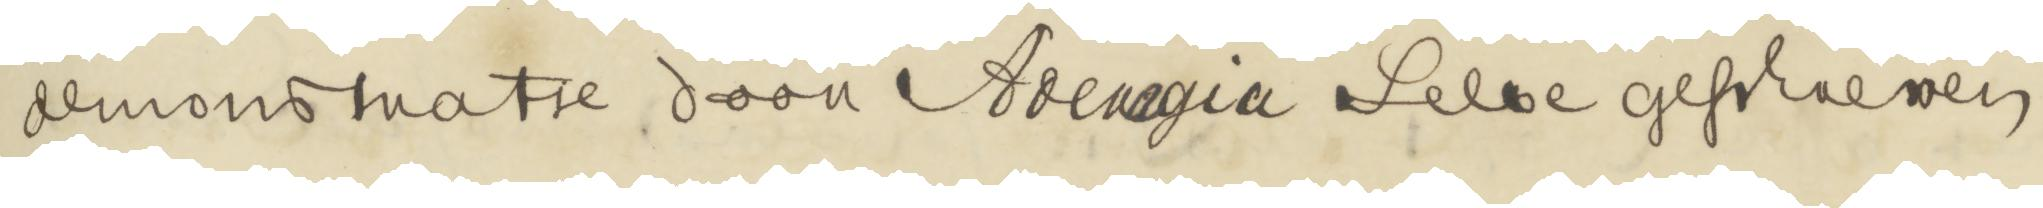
demonstratie door Aderagia selve geschreven
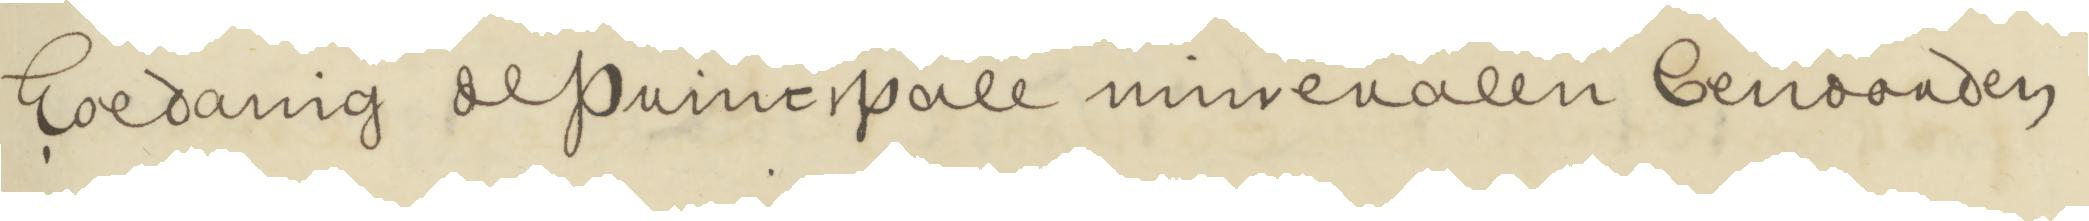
hoedanig de principale mineralen benoorden
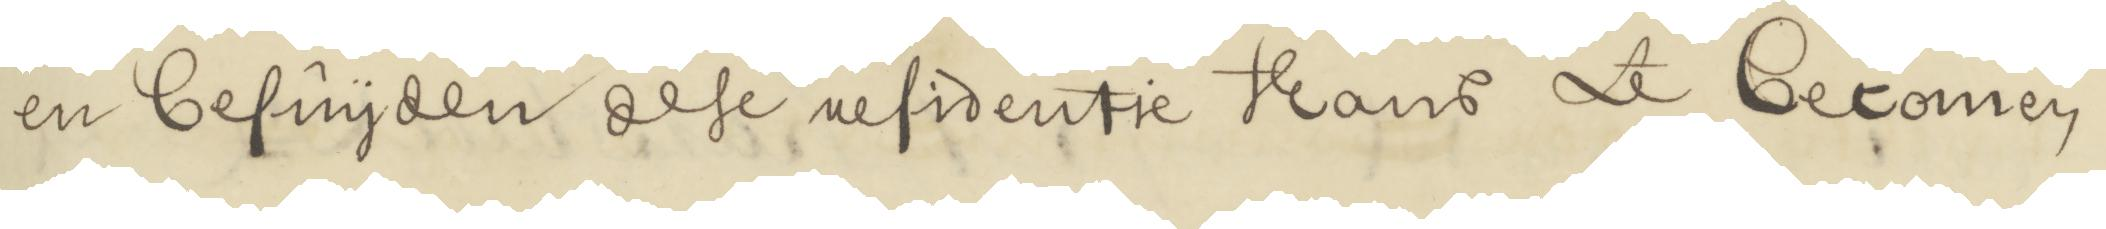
en besuijden dese residentie thans te becomen
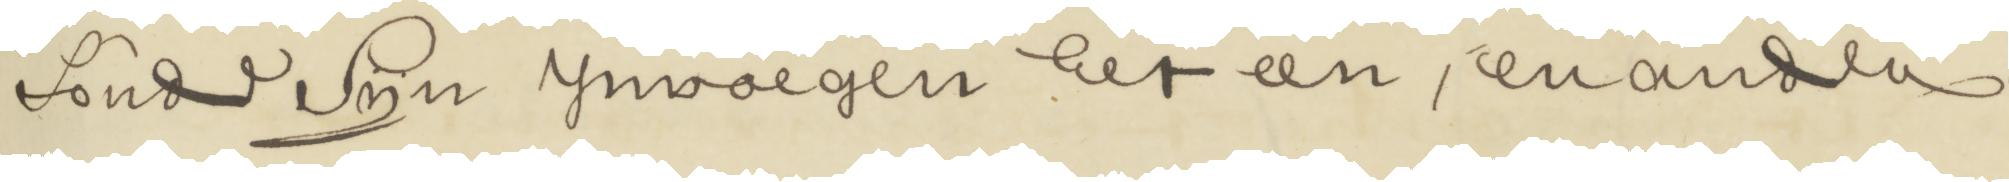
soude sijn Jnvoegen het een, en ander
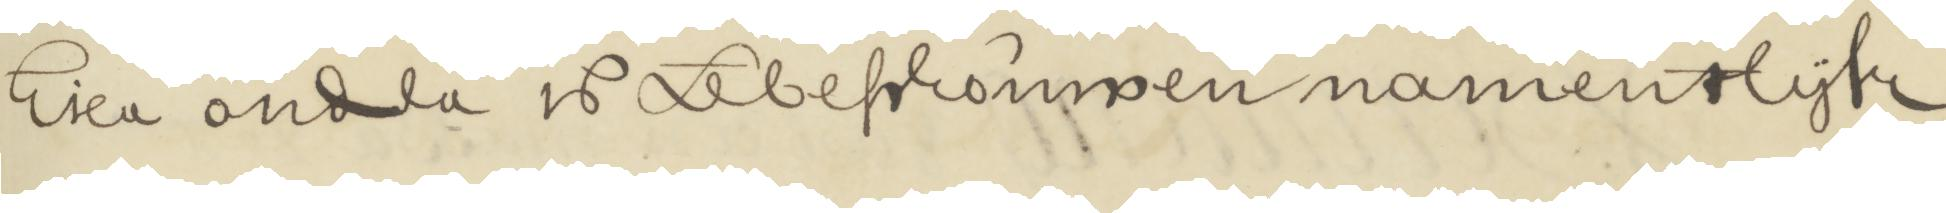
hier onder is te beschouwen namentlijk
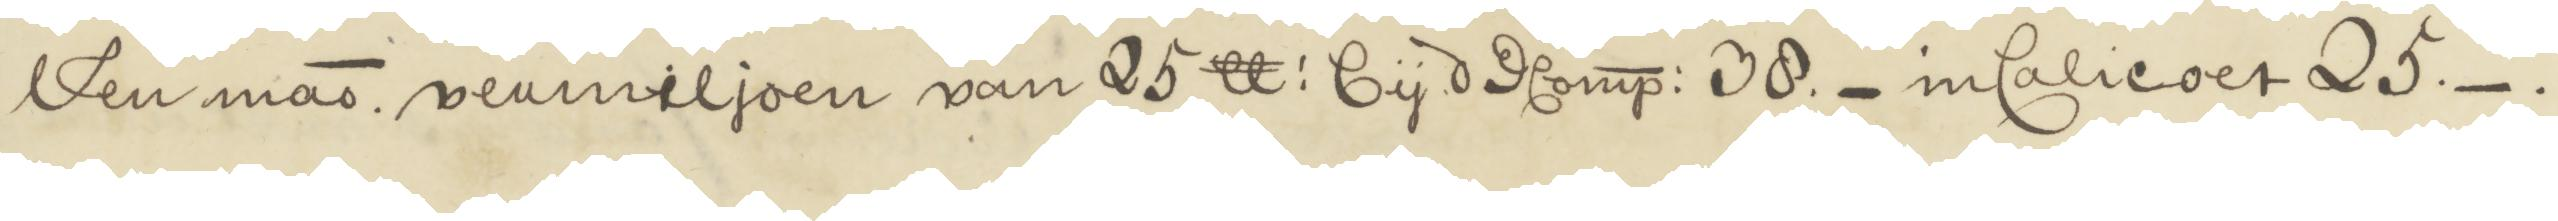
Een mao. vermiljoen van 25 lb: bij: dE Comp: 38. – in Calicoet 25. – .
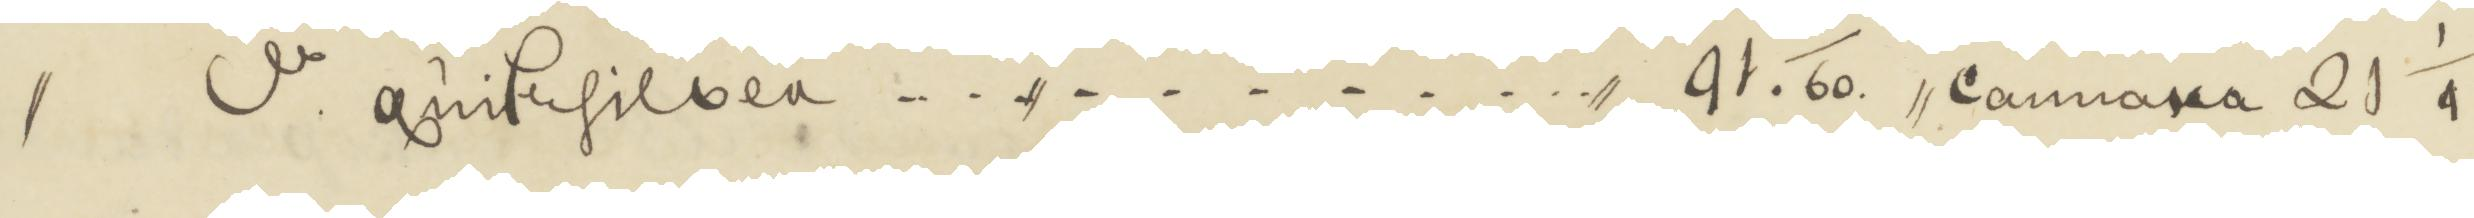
„ d.o quiksilver - - - „ - - - - - - . . „ 41.47/60. „ Cannara 21¼
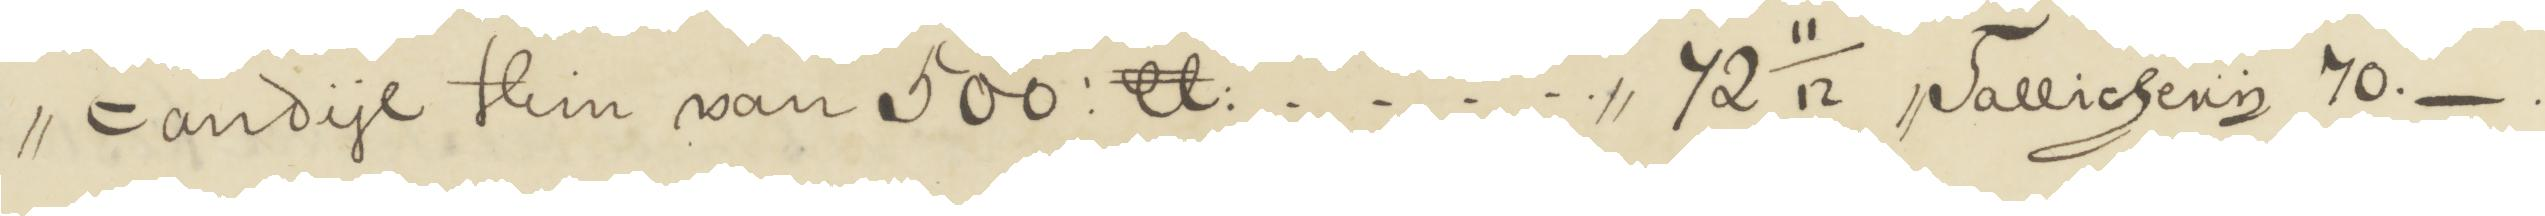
„ candijl thin van 500: lb: ..... „ 72 11/12 „ Tallicherij 70.—.
